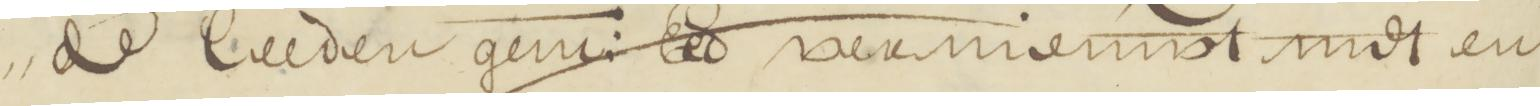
„de leeden gem: Eed vernieuwt met en
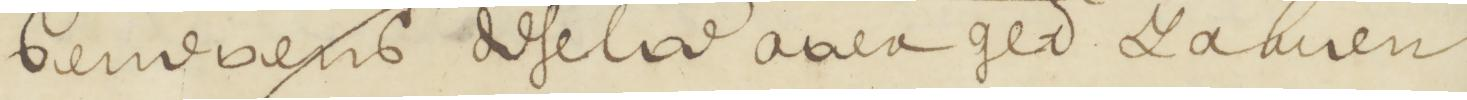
benevens deselve over ged.e zaken
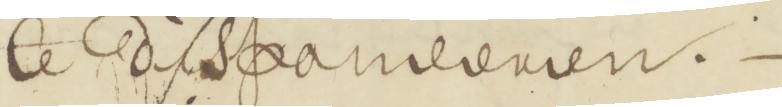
te disponeeren.
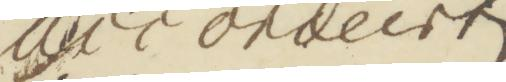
accodeert
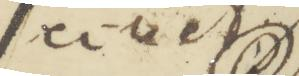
Secret
